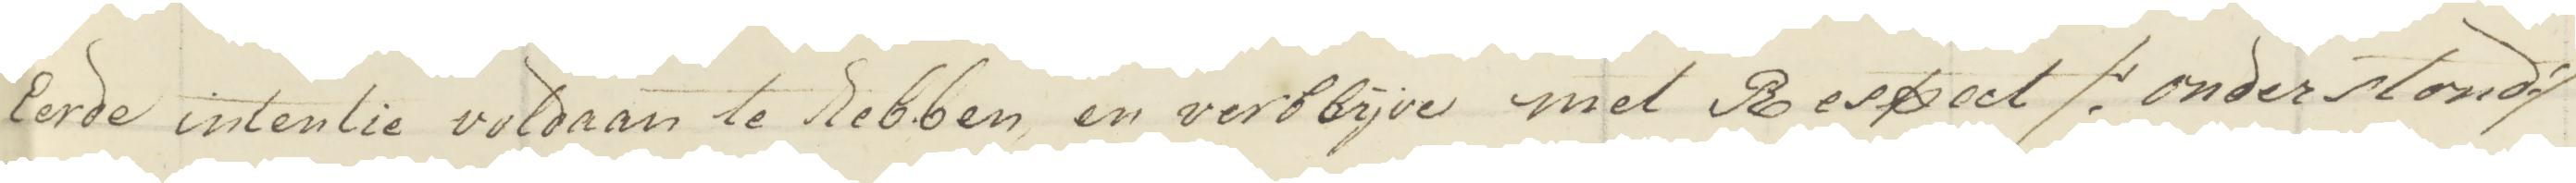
Eerde intentie voldaan te hebben en verblijve met Respect /:onderstond:/
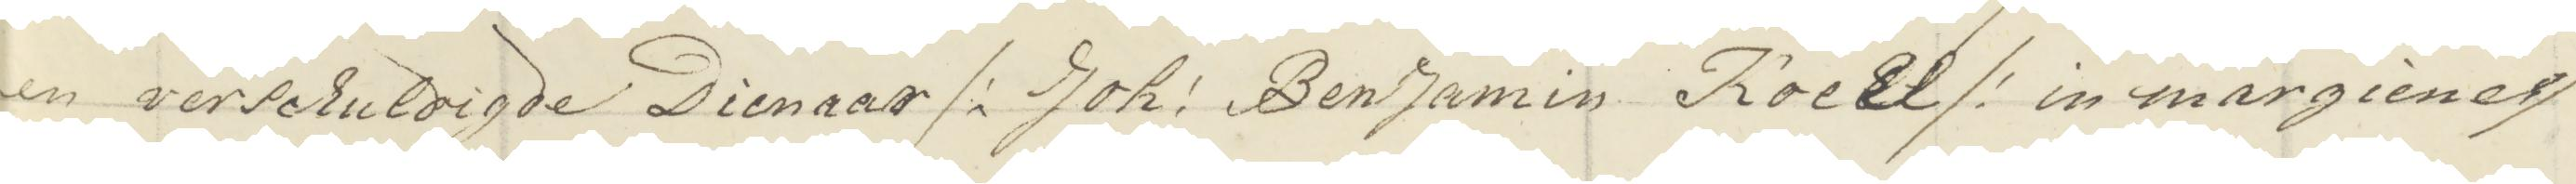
en verschuldigde Dienaar /: Joh: Benjamin Koehl /: in margienes/
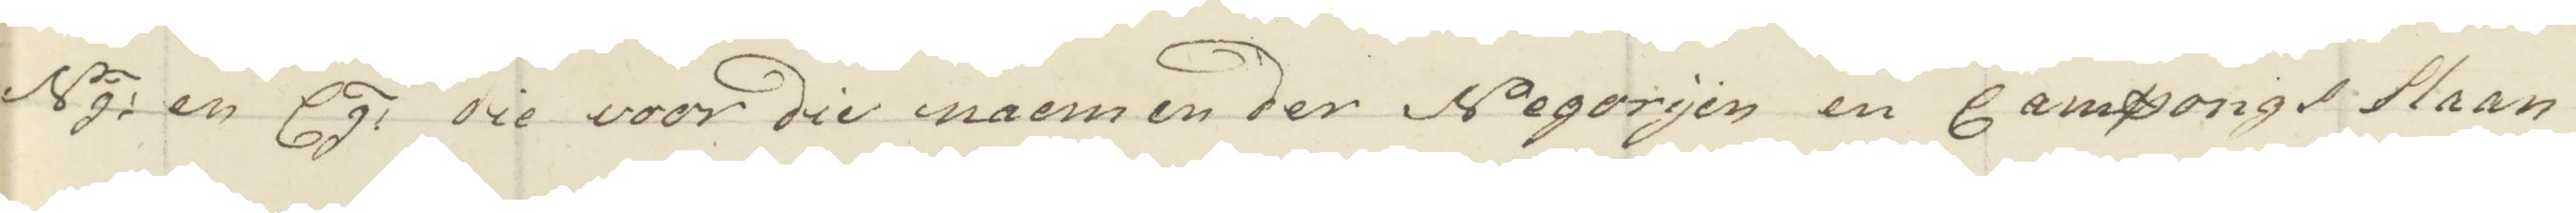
Ng: en Cg: die voor die naem en der Negorijen en Campongs staan
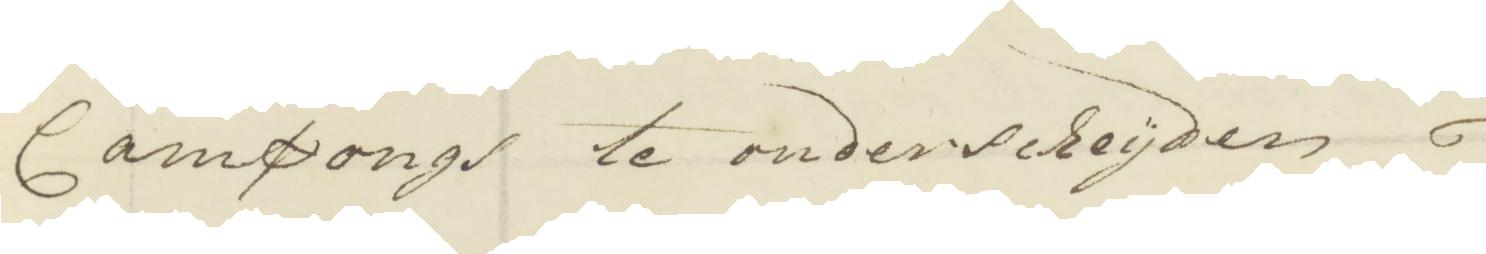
Campongs te onderscheijden —
